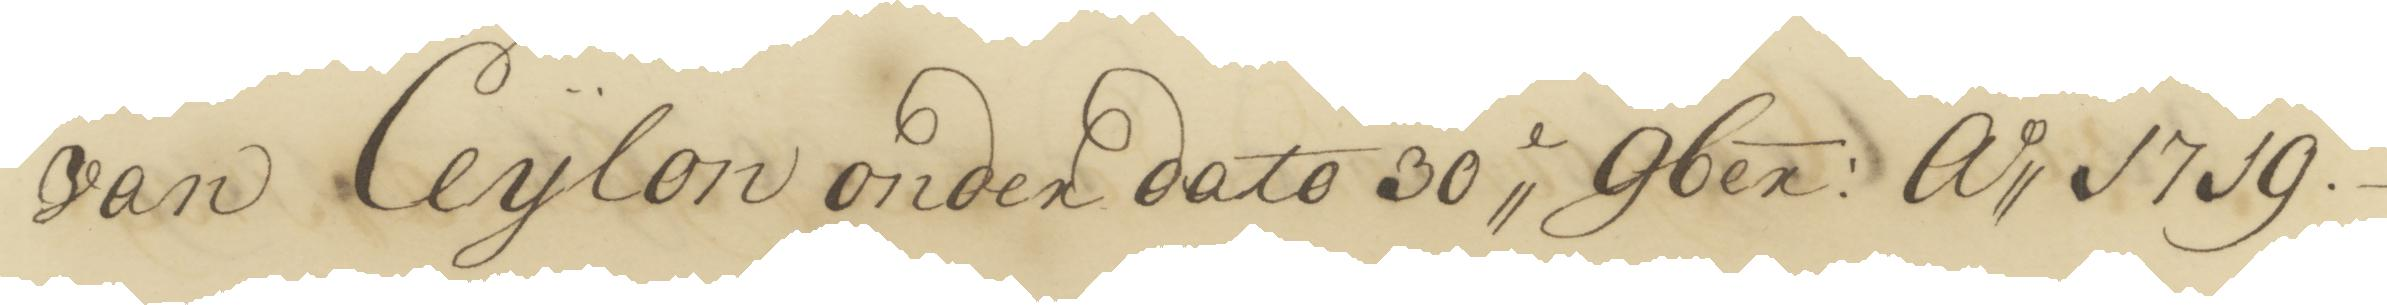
van Ceijlon onder dato 30„e 9ber: A„o 1719:
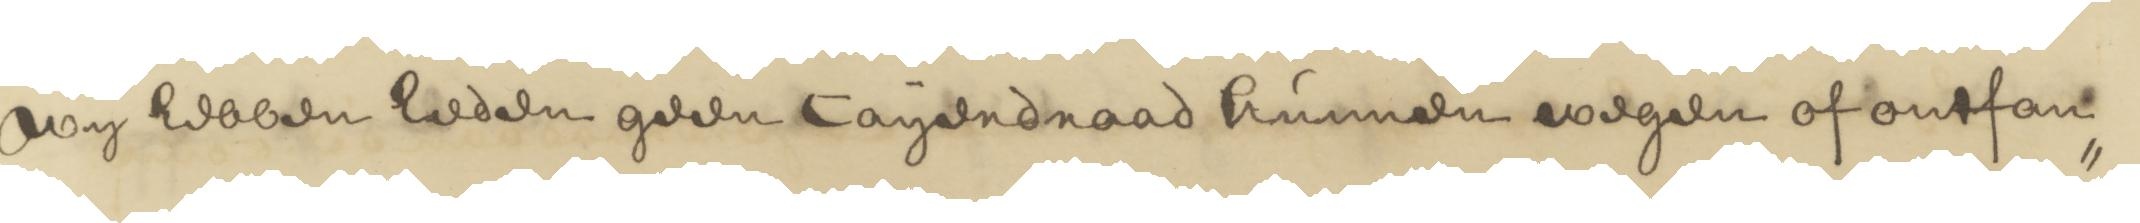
wij hebben heden geen caijerdraad kunnen wegen of ontfan„
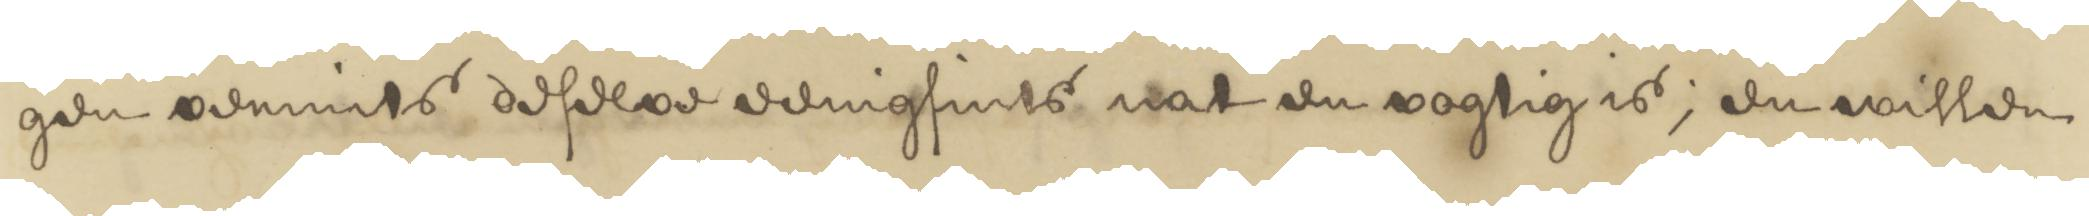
gen vermits deselve eenigsints wat en vogtig is; en willen
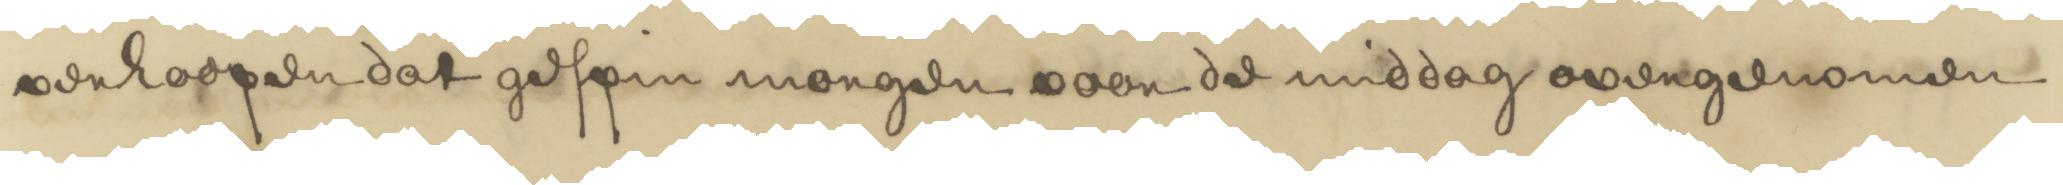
verhoopen dat gespin morgen voor de middag overgenomen
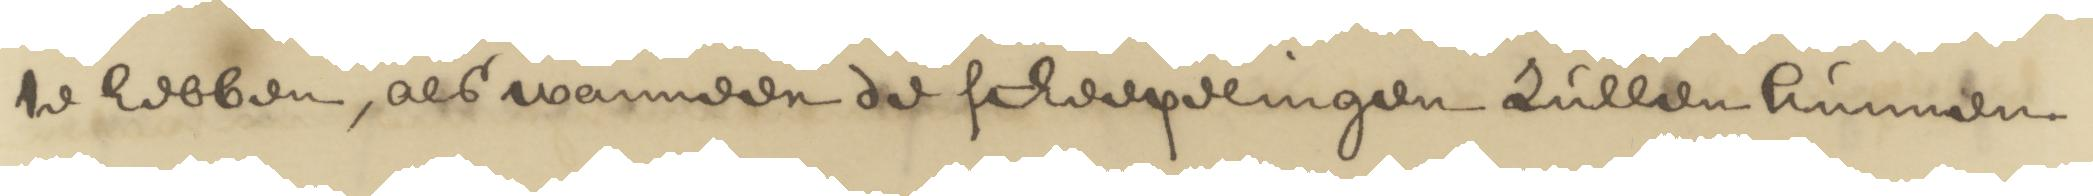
te hebben, als wanneer de scheepelingen zullen kunnen
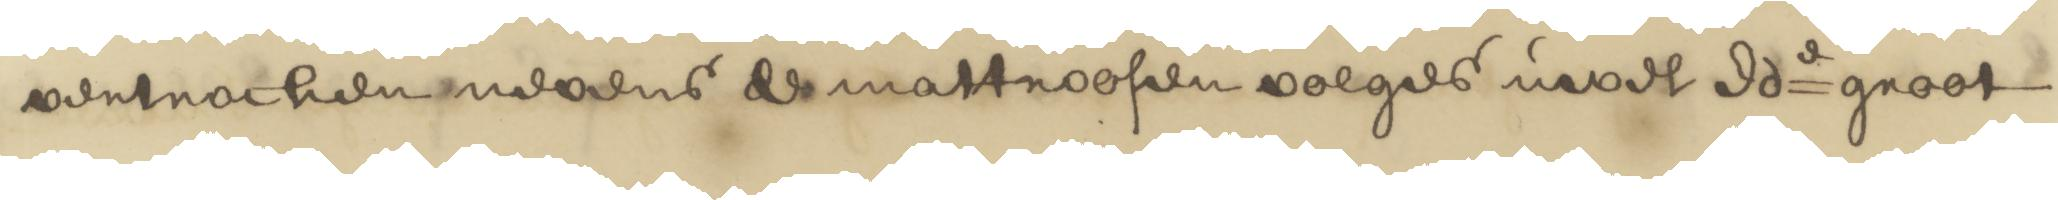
vertrocken nevens de mattroosen volges uwel Ed=e groot
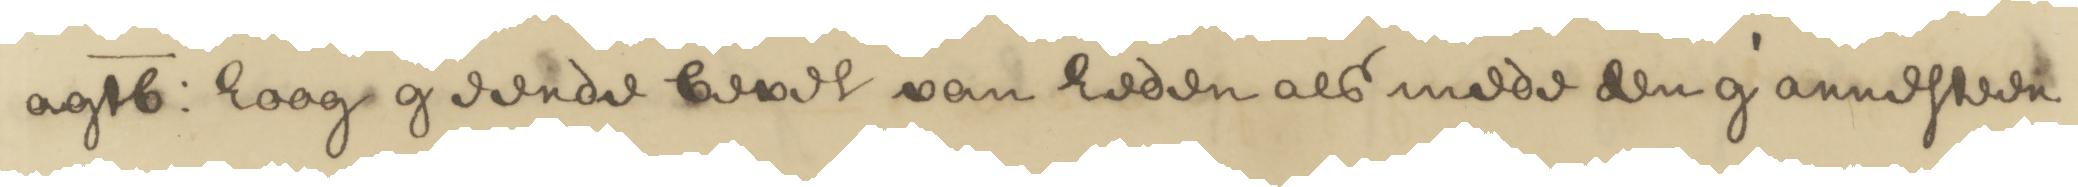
agtb: hoog g’eerde bevel van heden als mede den g’arresteer
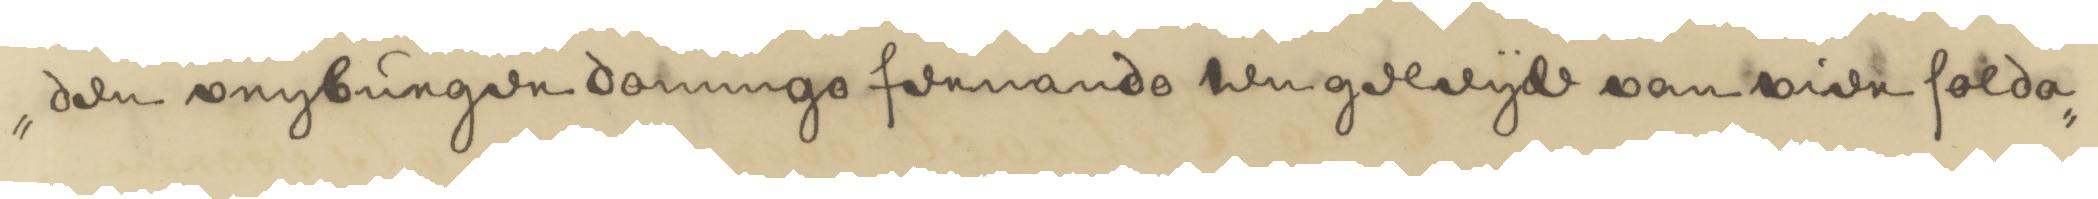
den vrijburger domingo fernando ten geleijde van vier solda„
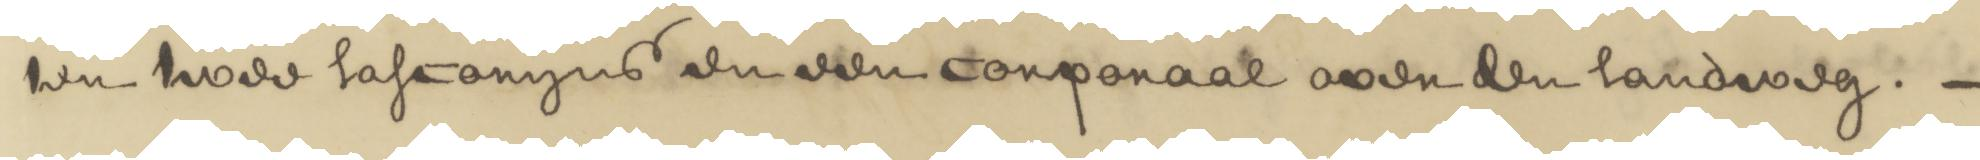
ten twee lascorijns en een corporaal over den landweg. —
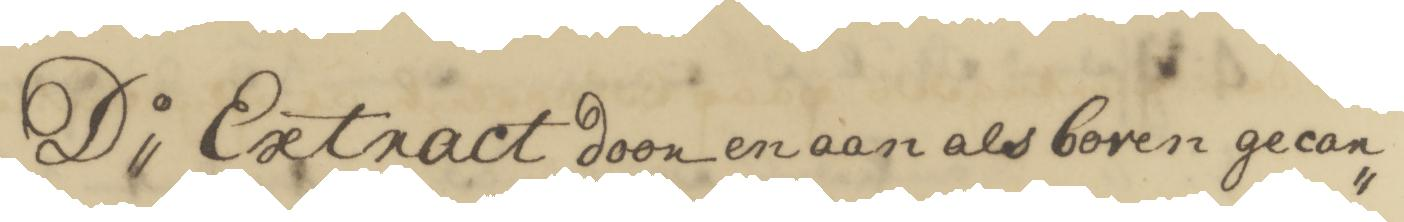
D„o Extract door en aan als boven gecan„
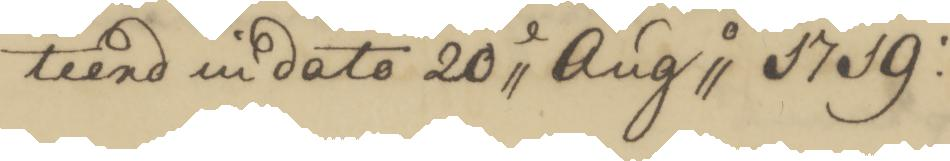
teerd in dato 20„e Aug„o 1719:
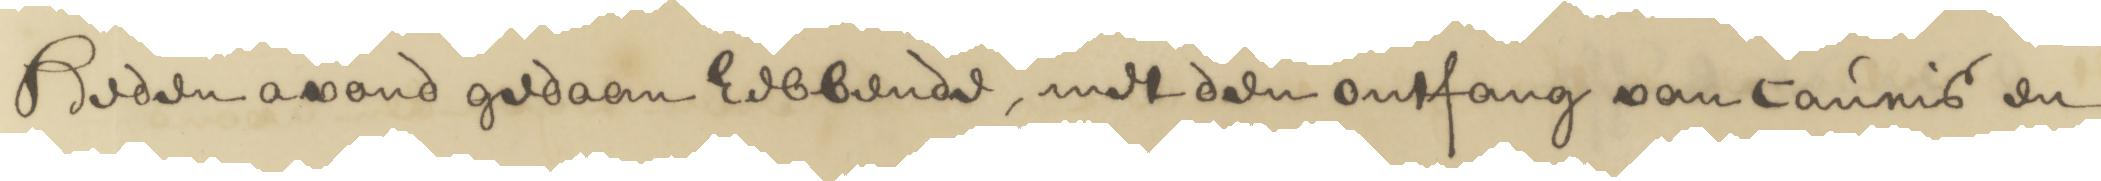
Heden avond gedaan hebbende, met den ontfang van cauris en
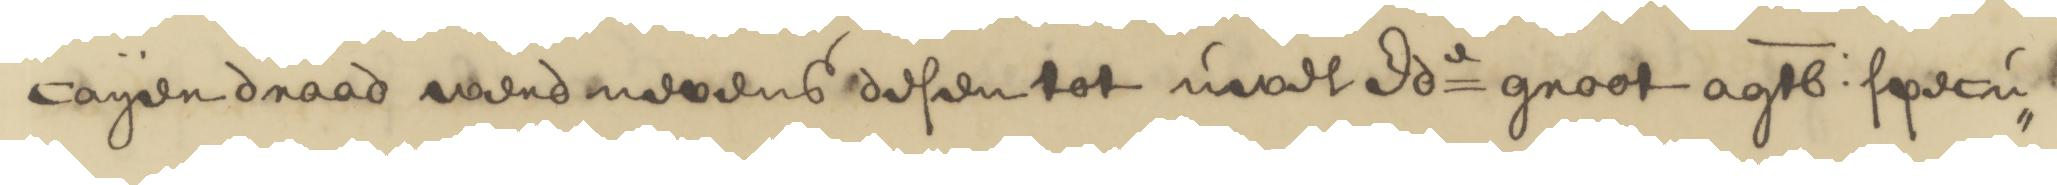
caijen draad werd nevens desen tot uwel Ed=e groot agtb: specu„
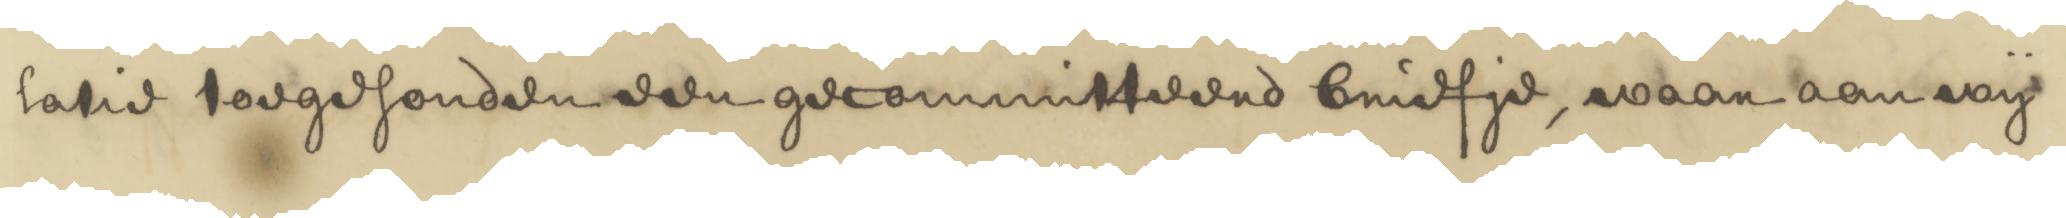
latie toegesonden een gecommitteerd briefje, waar aan wij
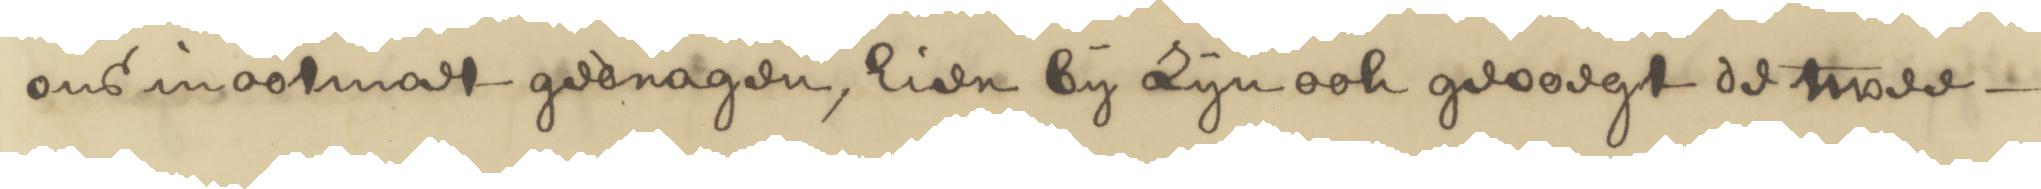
ons in ootmoet gedragen, hier bij zijn ook gevoegt de twee—
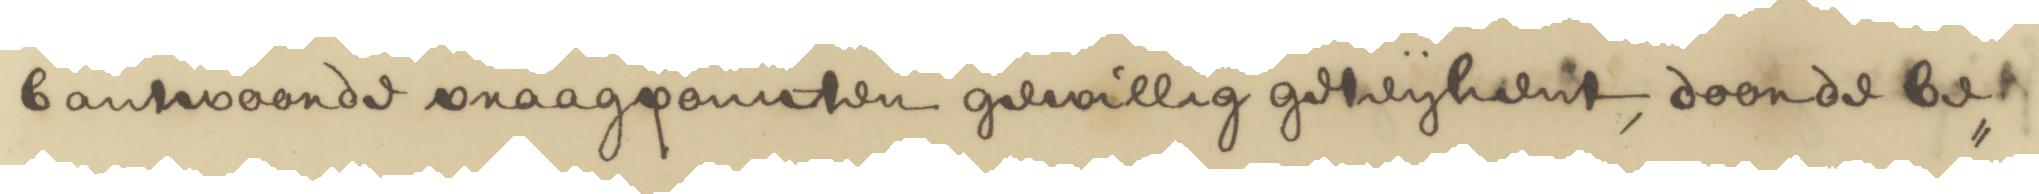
b'antwoorde vraagpoincten gewillig geteijkent, door de be„
